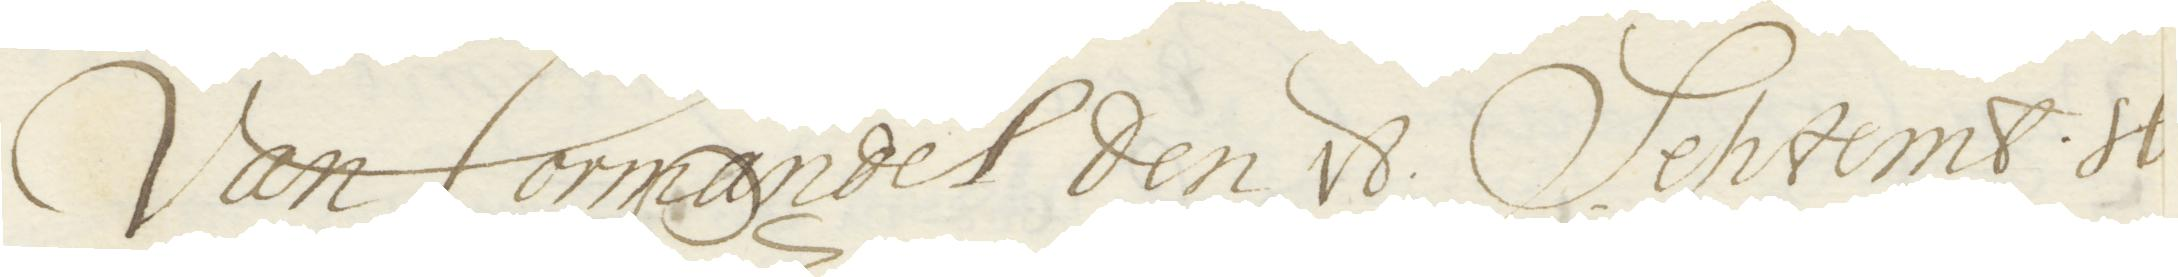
Van Cormandel den 18. Septemt: 16
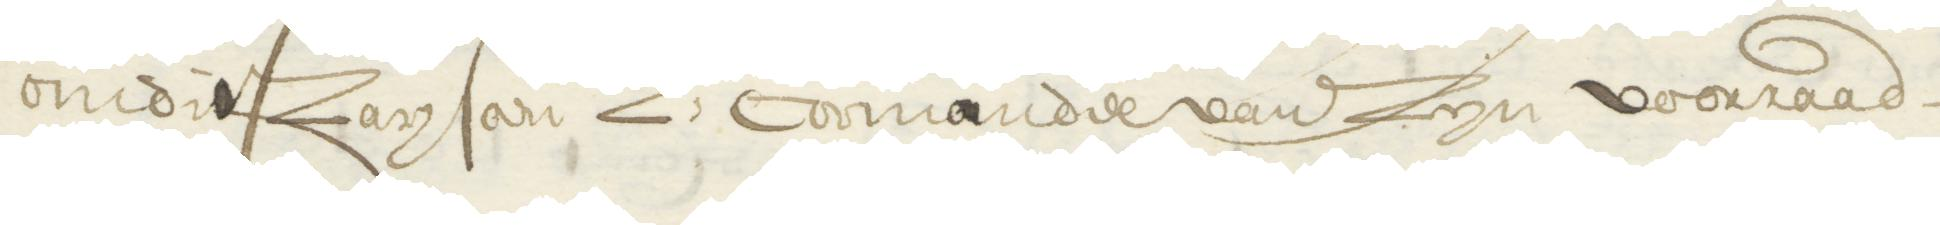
om dit Zaijsoen Z: Cormandel van Zijn voorraad
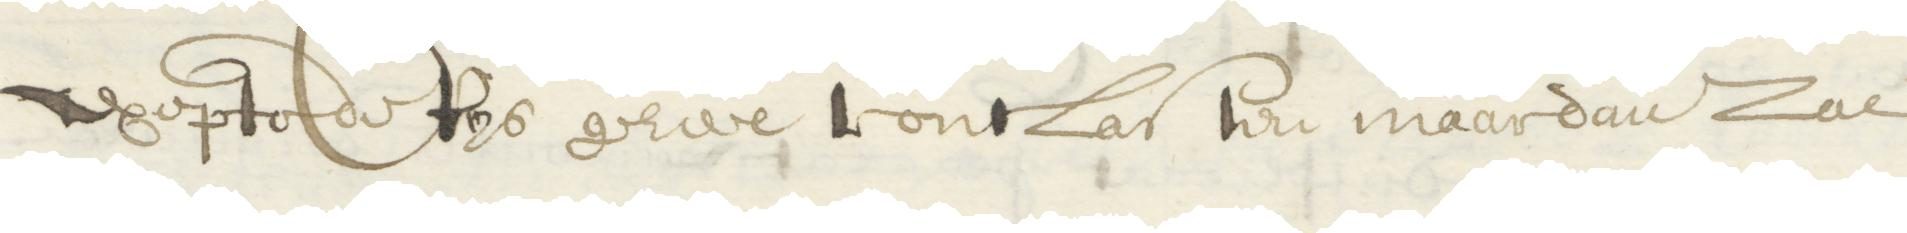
exepto de Rijs geheel te ontlasten maar dan Zal
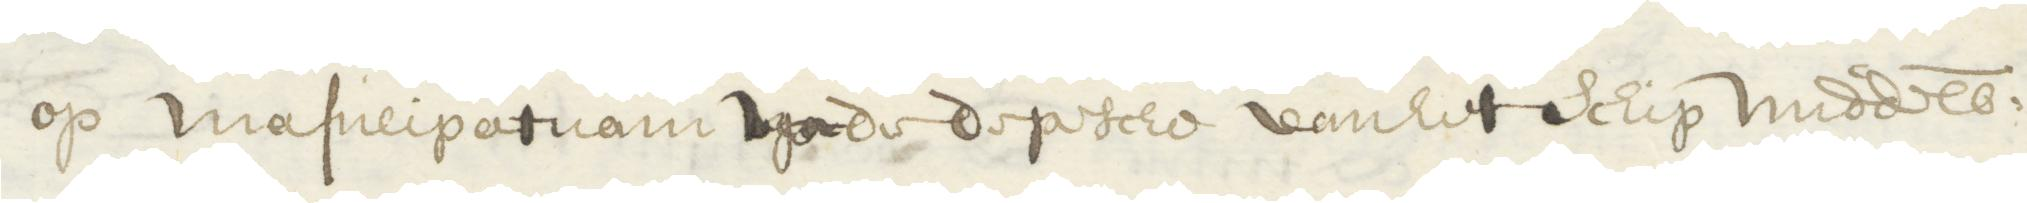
op masulipatnam vgn de depesche van het Schip middelb:
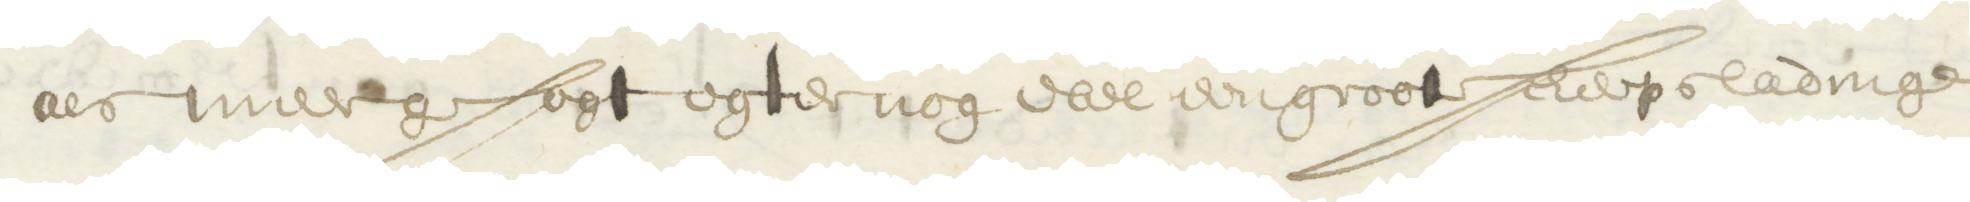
als meer gesogt egter nog wel een groot Scheepsladinge
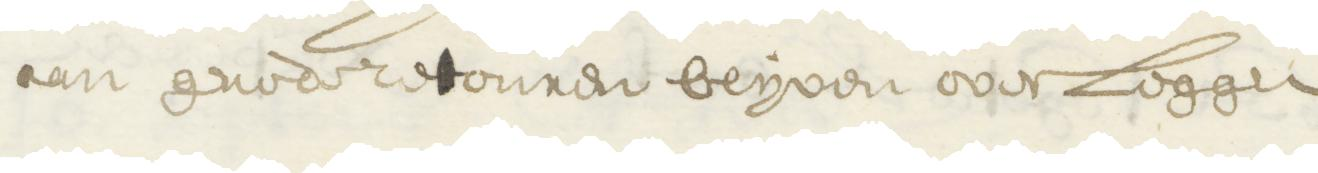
aan gerede retouren blijven overleggen
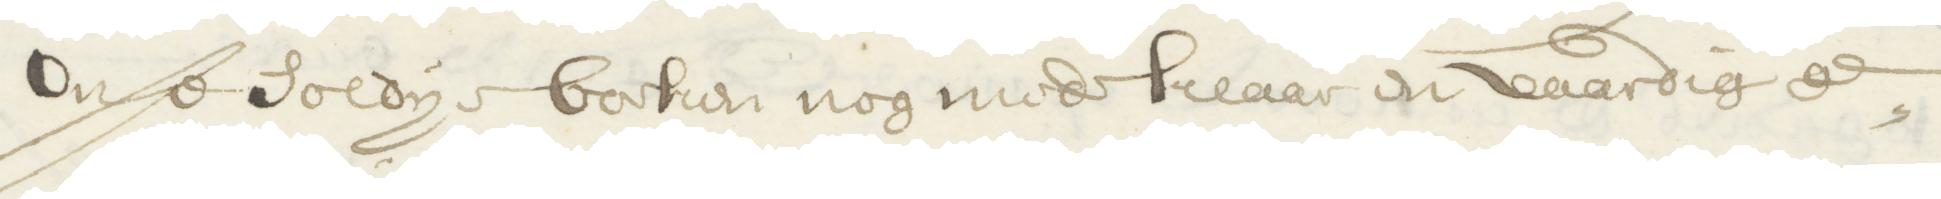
onse soldije boeken nog mede klaar en vaardig ge„
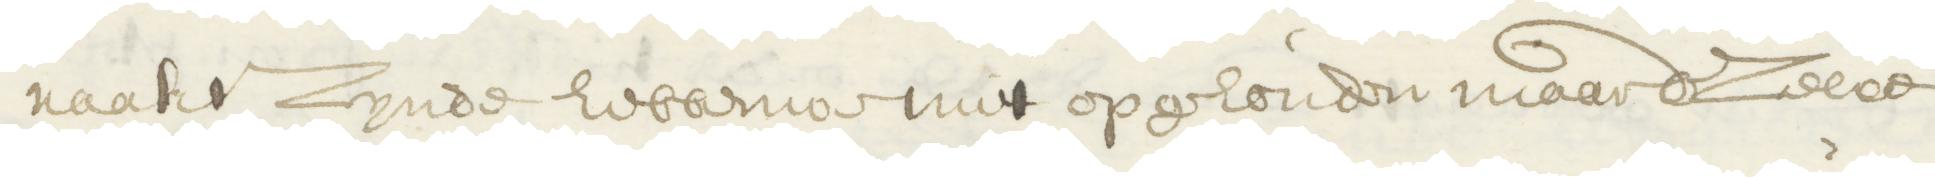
raakt Zijnde hebben we niet op gehouden maar dezelve
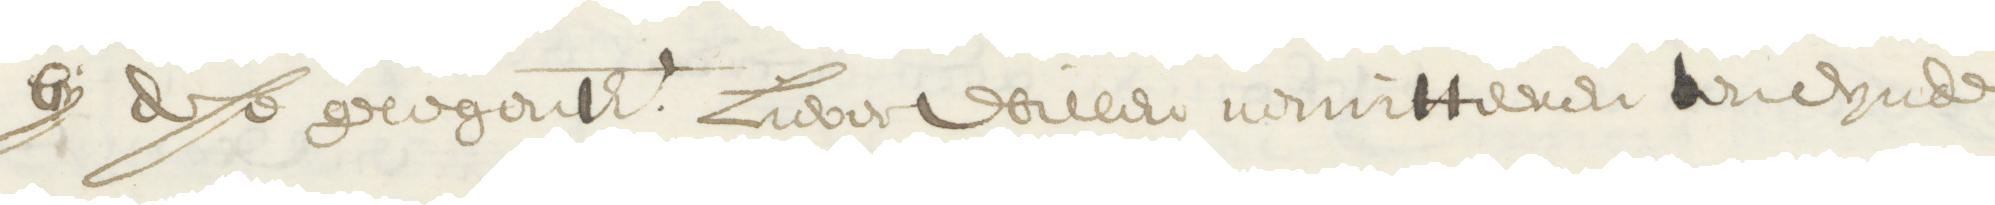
bij dese gelegenth:t Liever willen remitteeren ten eijnde
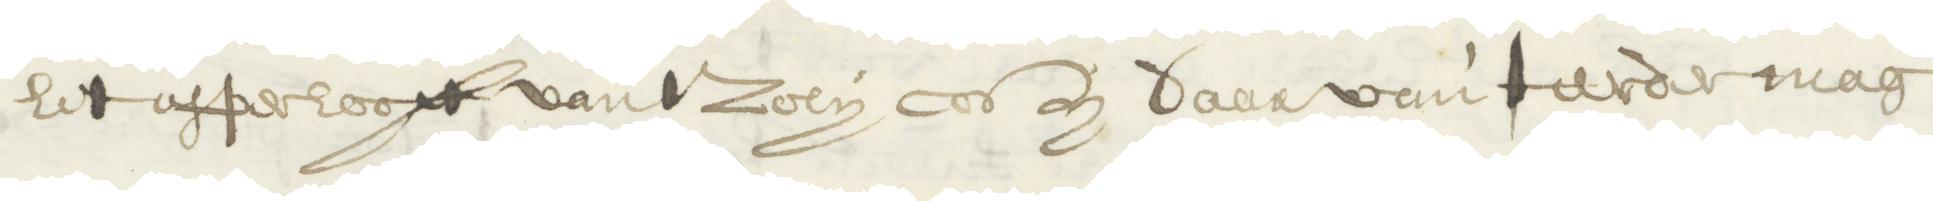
het opperhooft, van 't zolij costy daar van 't eerder mag
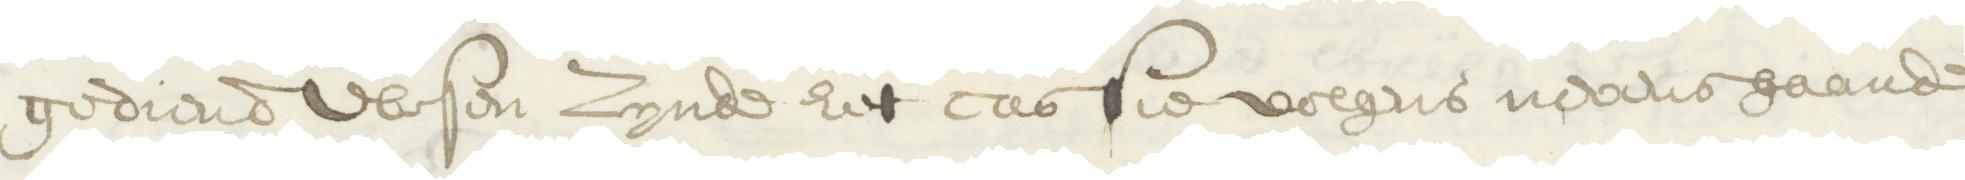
gediend wesen Zijnde het cassie volgens nevens gaande
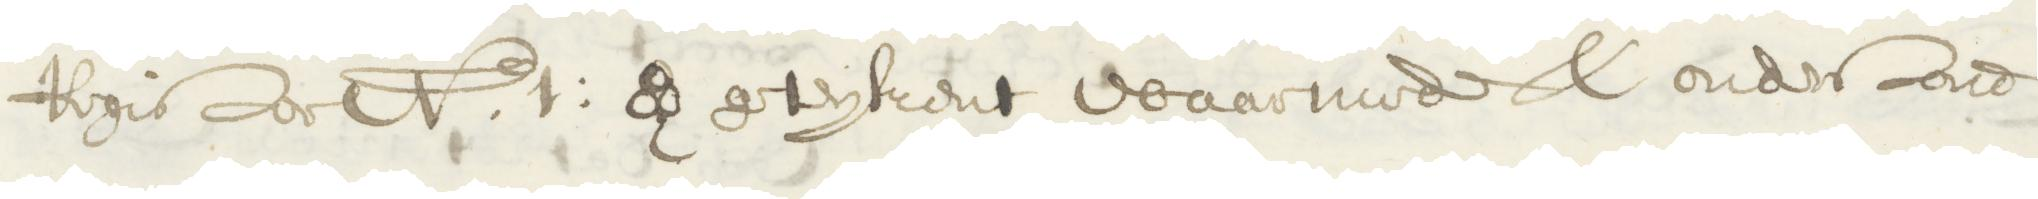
Register N.o 1: o; ooo geteijkent waar mede & onderstond
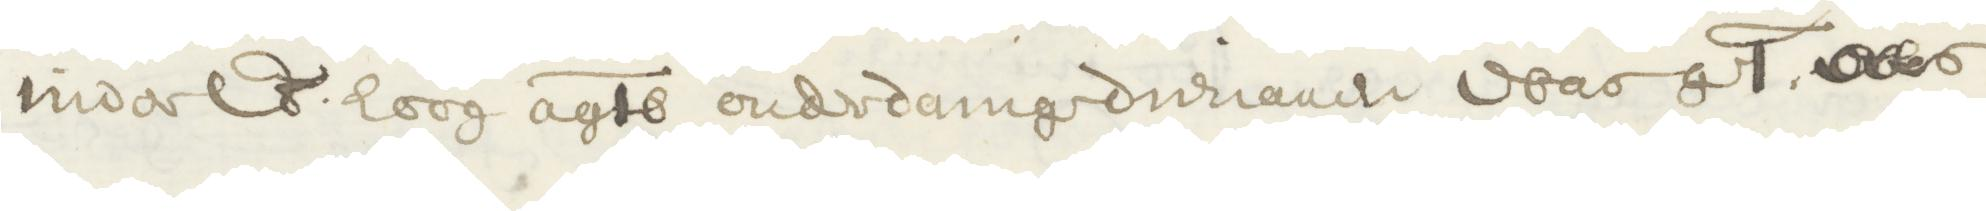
uwer Ed: hoog agtb onderdanige dienaren was get, als
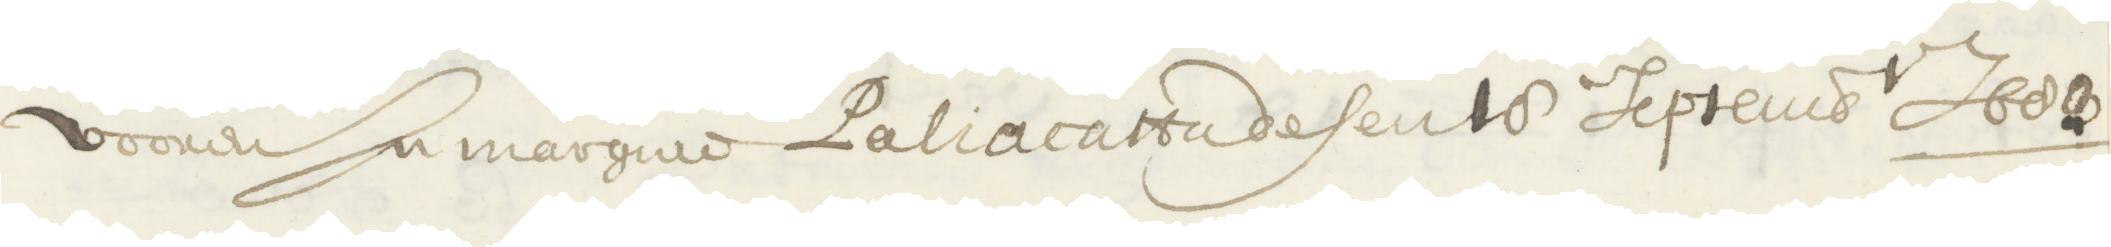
vooren In margine Paliacatta desen 18 Septemb:r 1682
